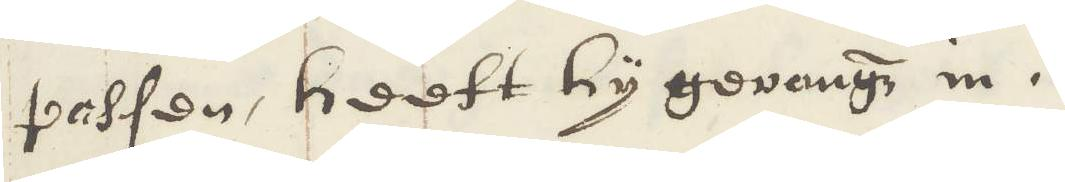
passen, heeft hij gevangn in.
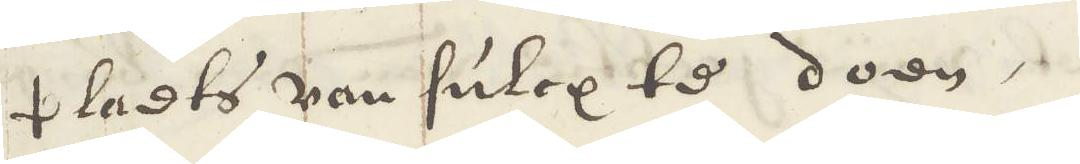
plaets van sulcx te doen,
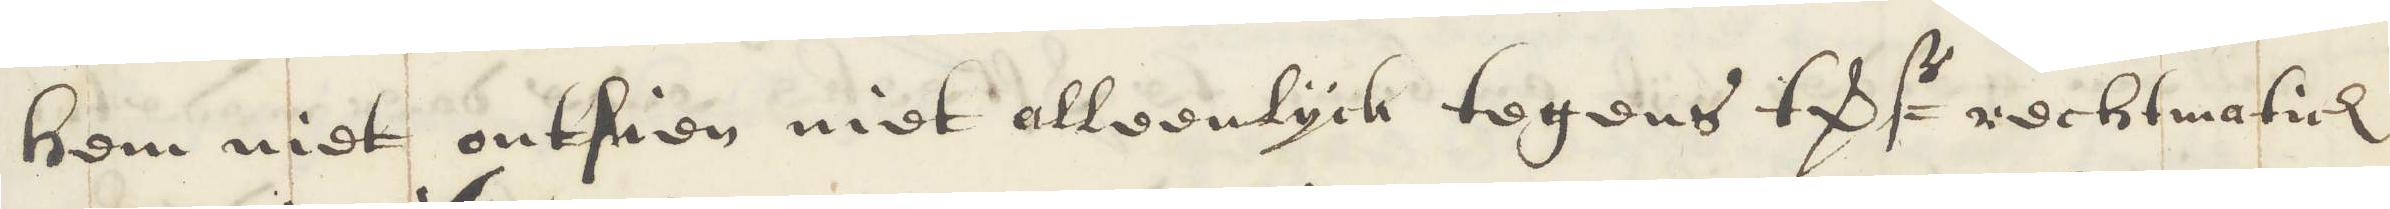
hem niet ontsien niet alleenlijck tegens ’t vers=z rechtmatich
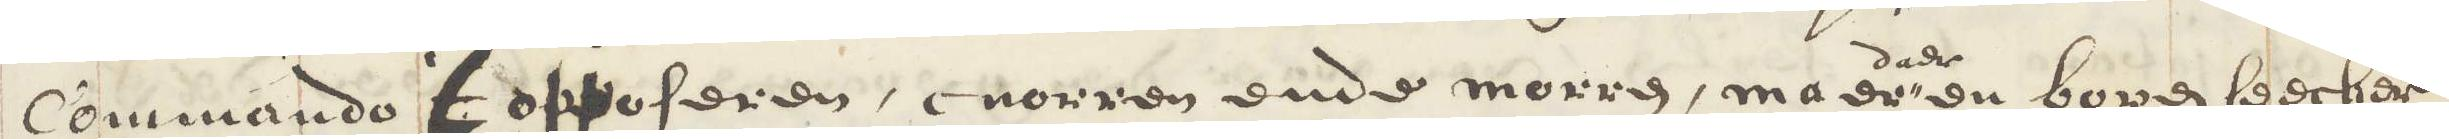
Commando 't opposeren, cnorren ende morren, maer „daer en boven seecker
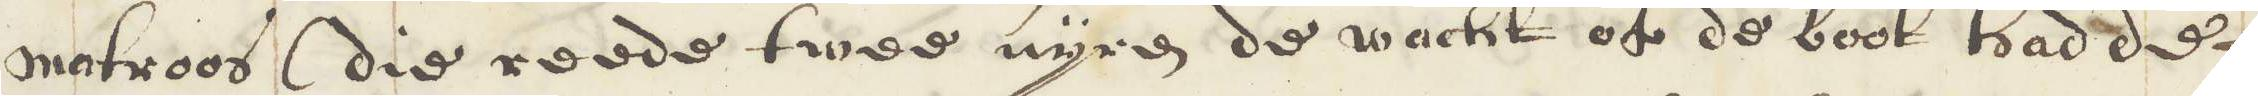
matroos (die reede twee uijren de wacht op de boot hadde-
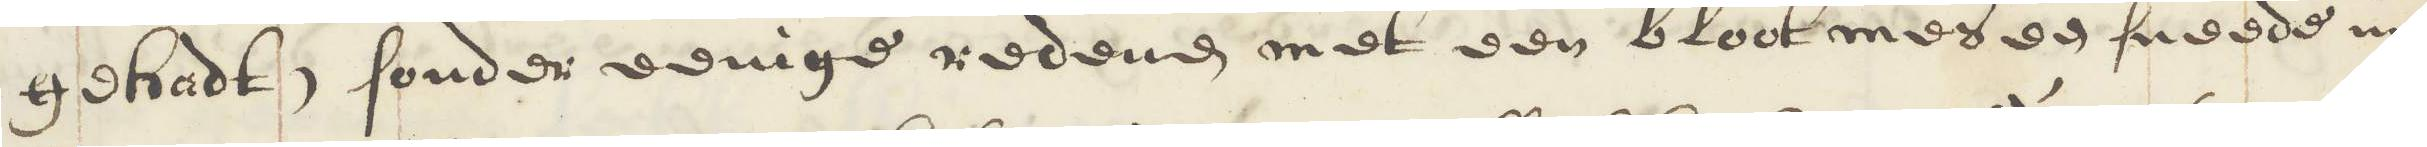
gehadt) sonder eenige redenen met een bloot mes een sneede in
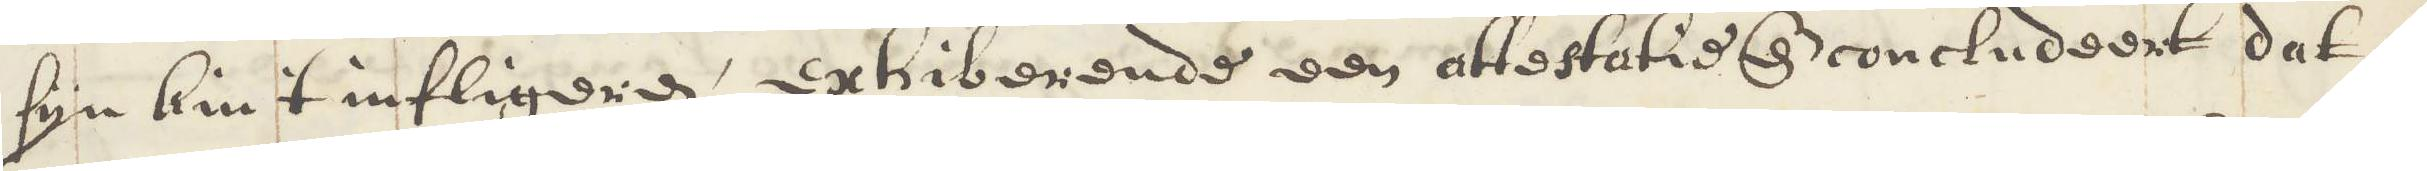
sijn kin 't infligeren exhiberende een attestatie ende concludeert dat-
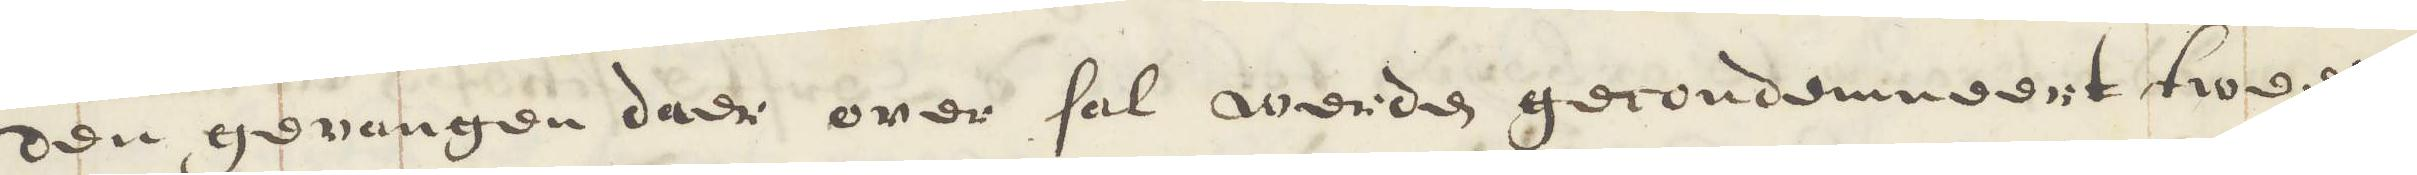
den gevangen daer over sal werden gecondenneert twee-
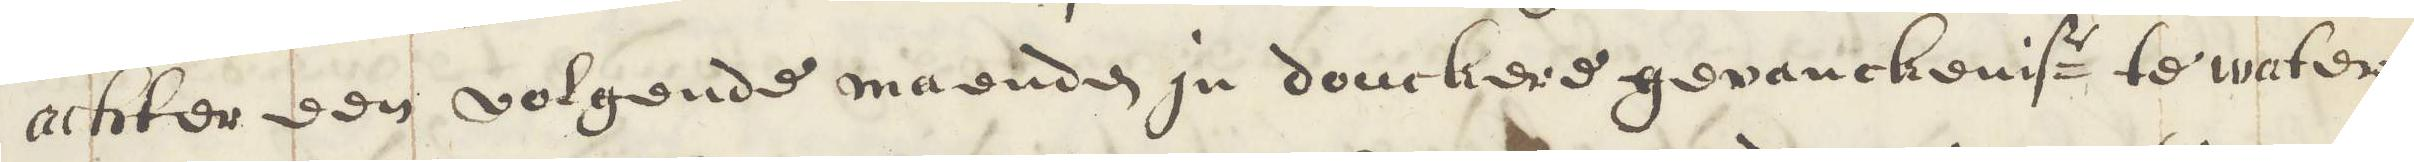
achter een volgende maenden jn donckere gevanckenis=r te water
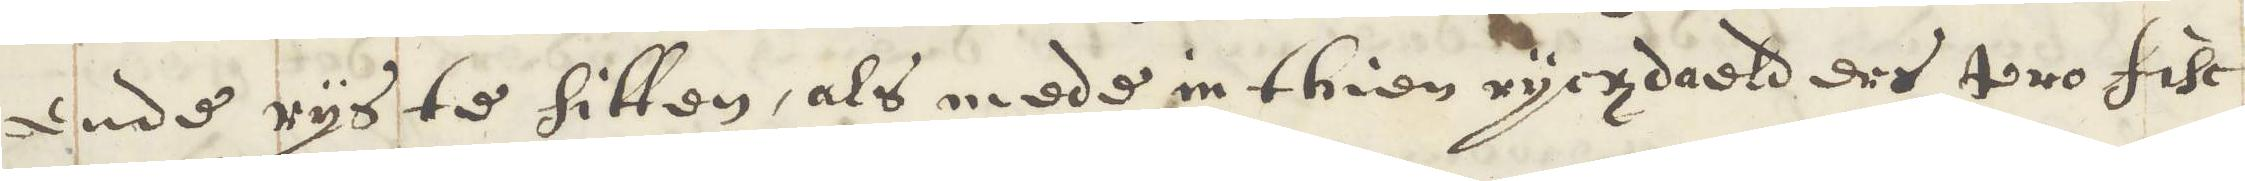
ende rijs te sitten, als mede in thien rijctdaelders pro fisco
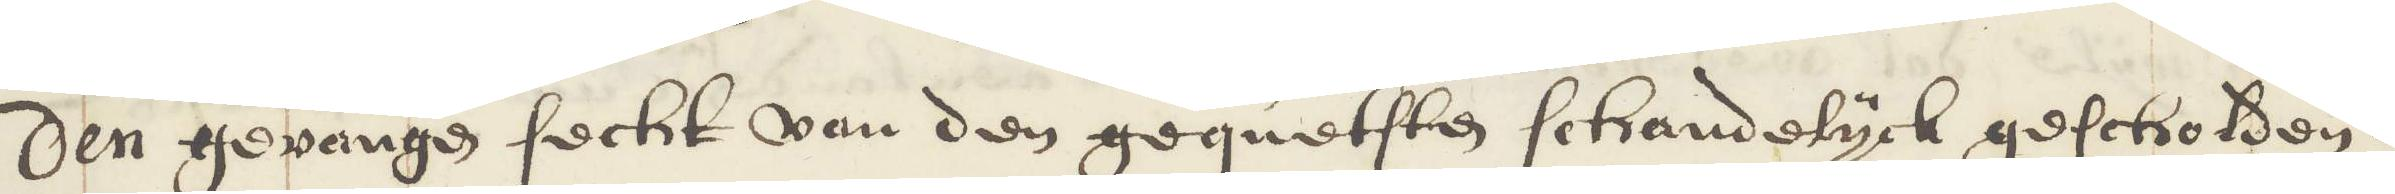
den gevangen secht van den gequetsten schandelijck gescholden
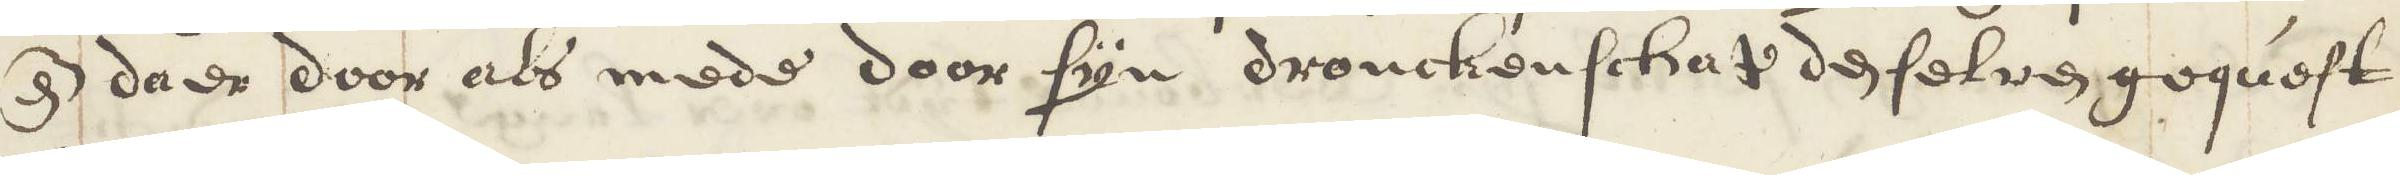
en daer door als mede door sijn dronckenschap den selven gequest
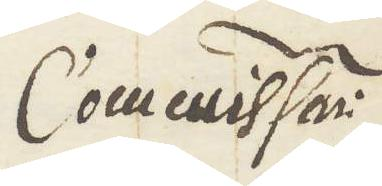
C'ommissa:
